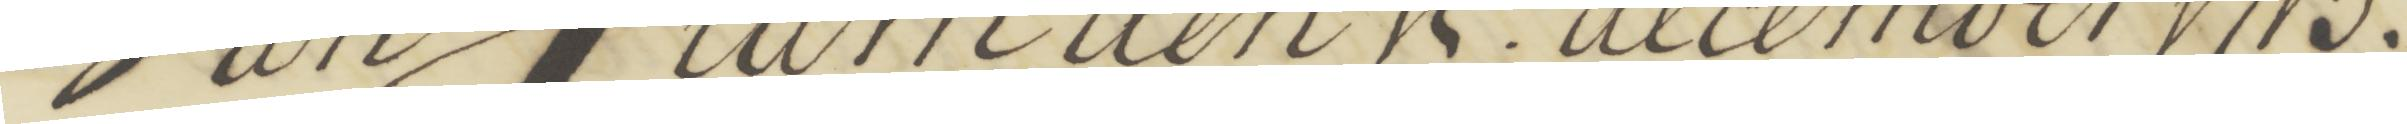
Van Siam den 15:' december 1713.
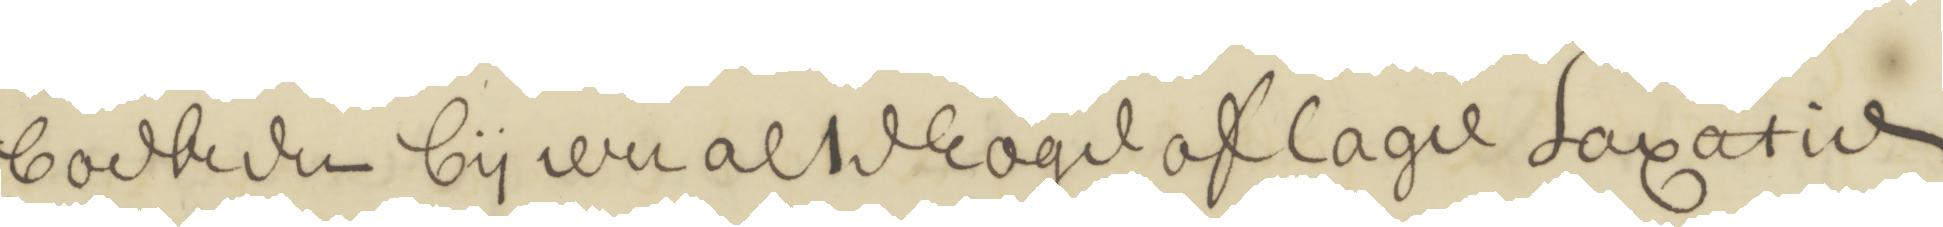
boeken bij een altehoge oflage taxatie
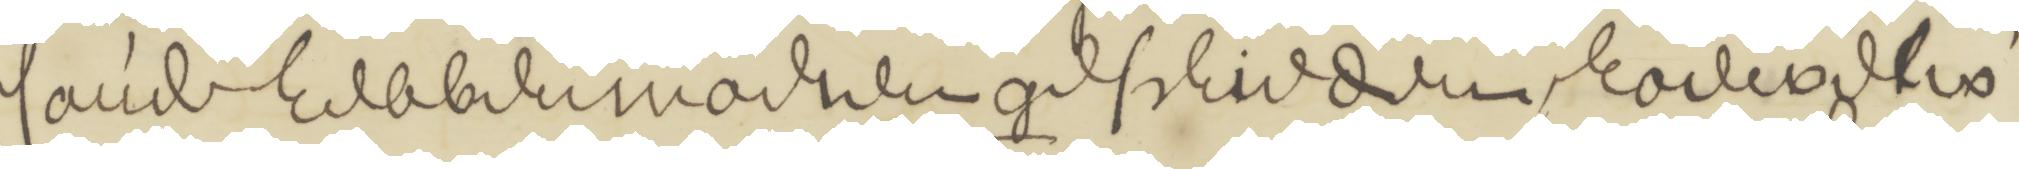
soude hebben moeten geschieden, hoewel w'
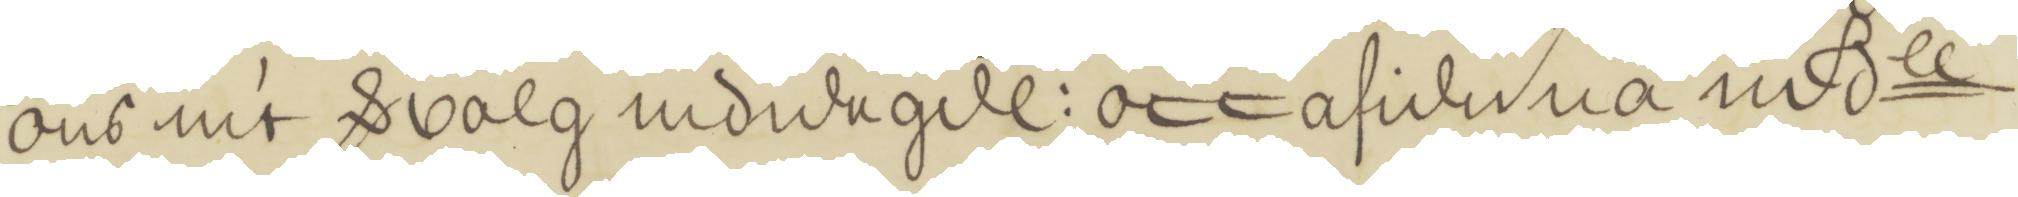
ons in’t vervolg indier gel: occasien na uEd=le
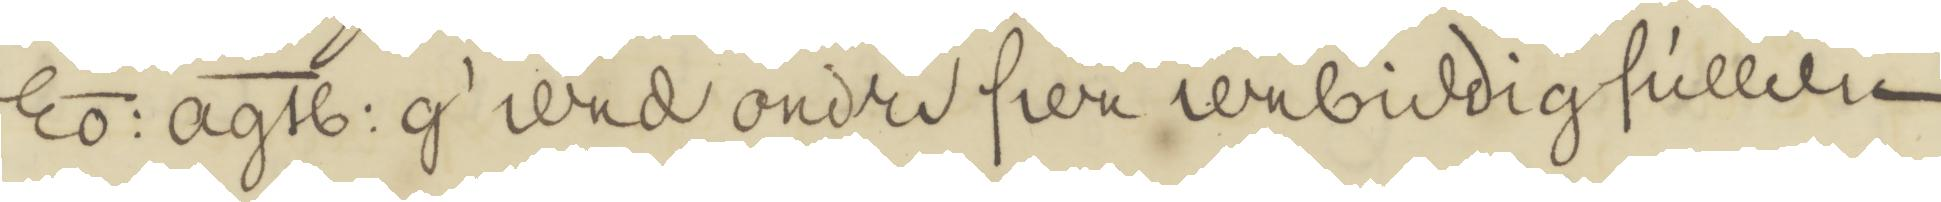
ho: agtb: g’eerde ordre seer eerbiedig sullen
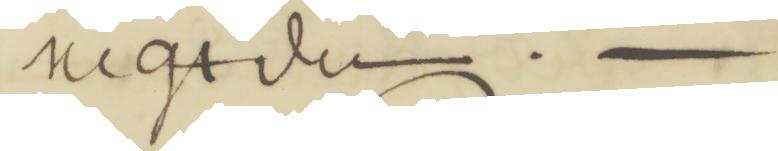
rigten. —
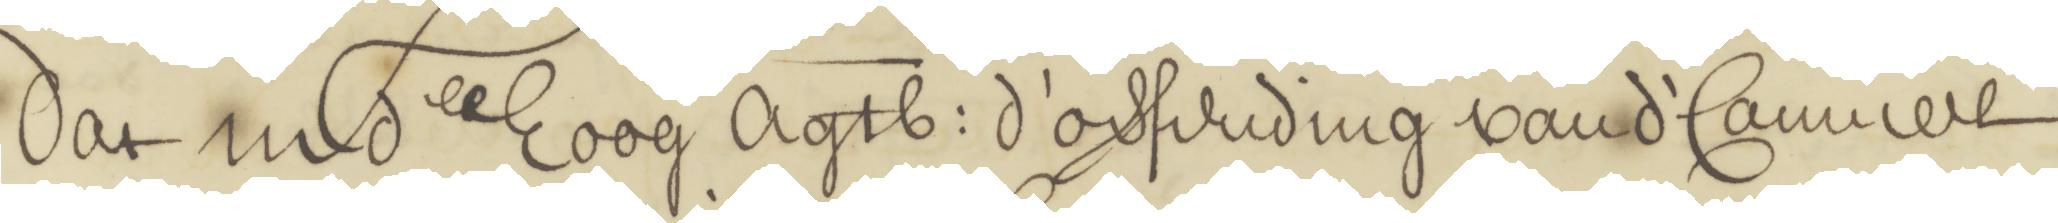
dat uEdle hoog Agtb: d’oversending van d’ Canneel
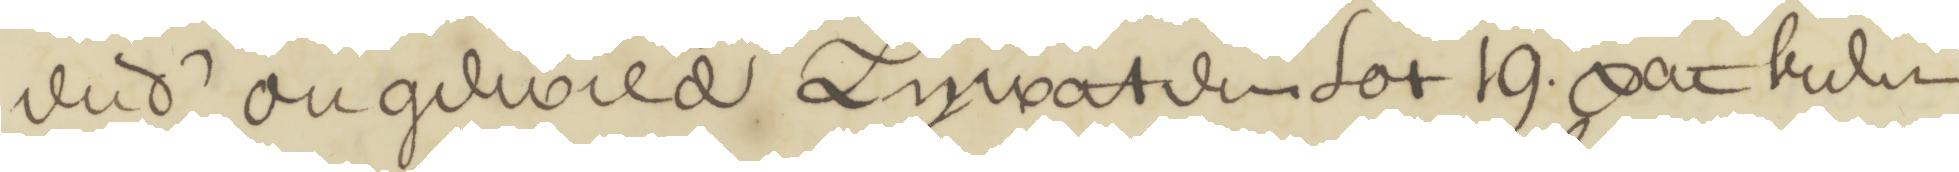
end' ongewilde Lywaten tot 19. packen
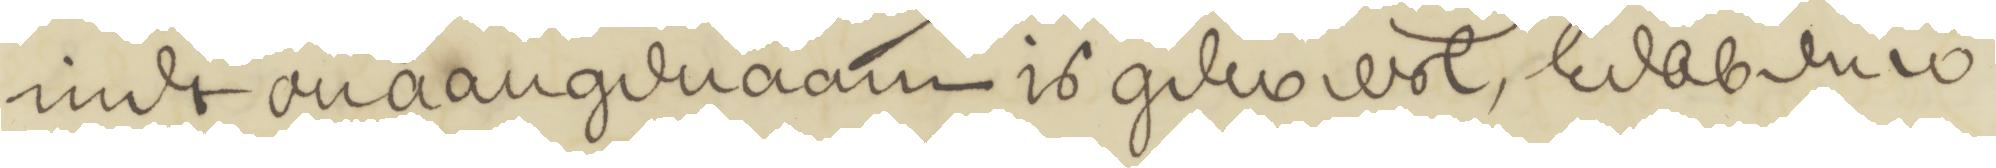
niet onaangenaam is geweest, hebben w'
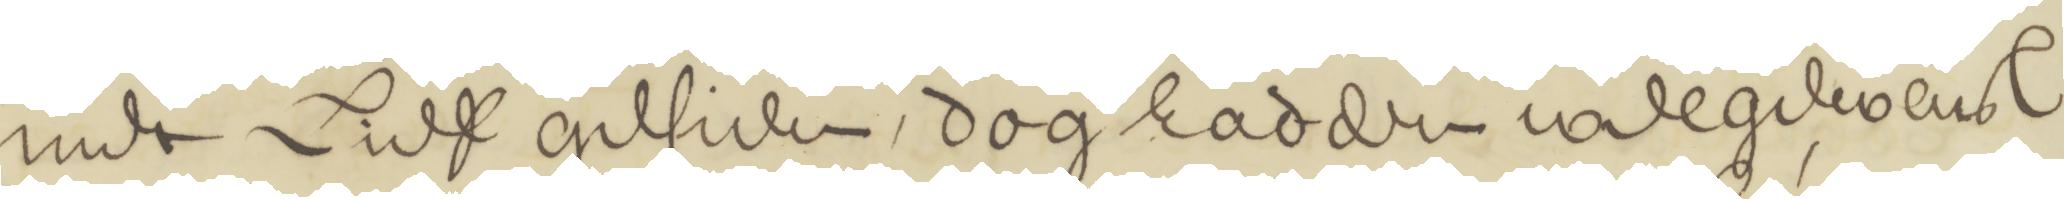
met Lief gesien, dog hadden welgewenst
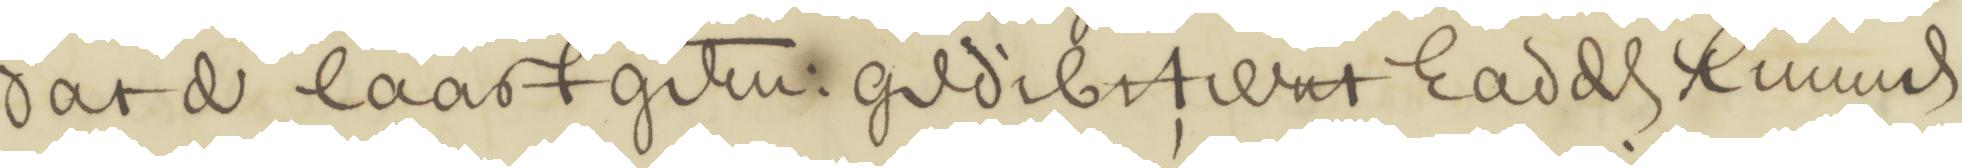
dat de laast gem: gedibiteert hadden kunnen
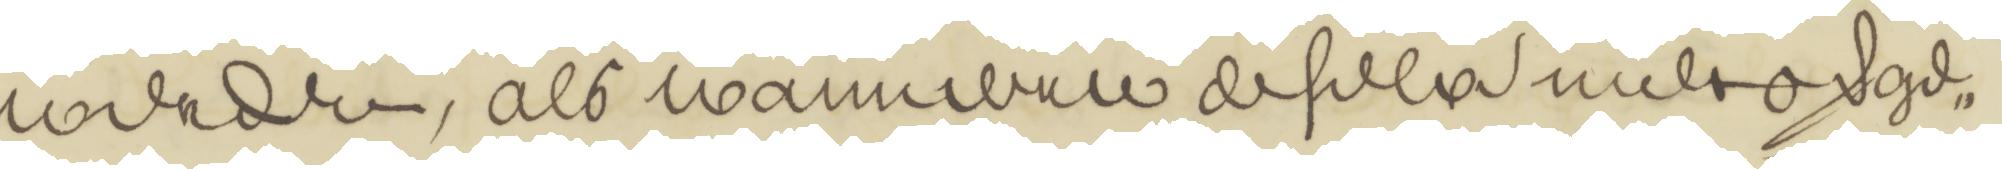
werden, als wanneere deselve niet overge„
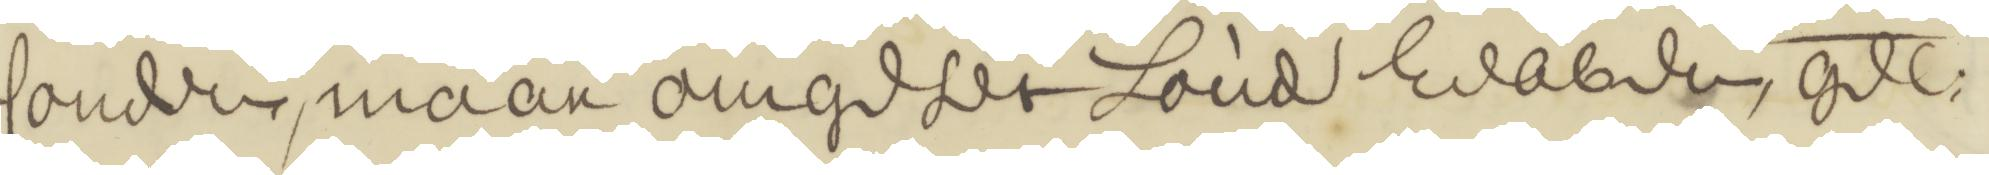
sonden, maar omgeset zoude hebben, gel:
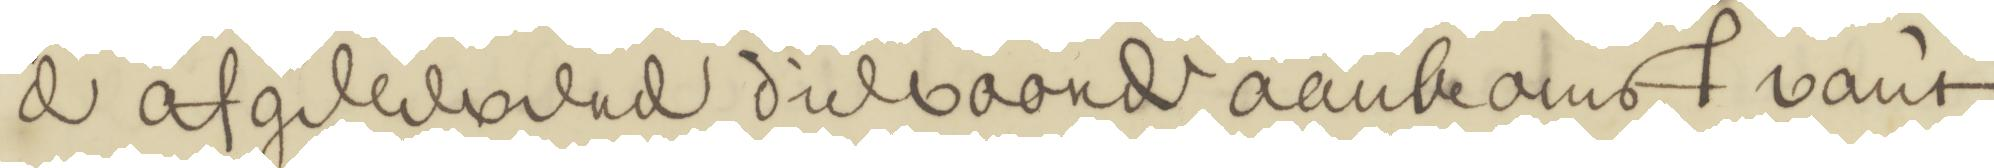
de afgeleverde dievoorde aankomst van’t
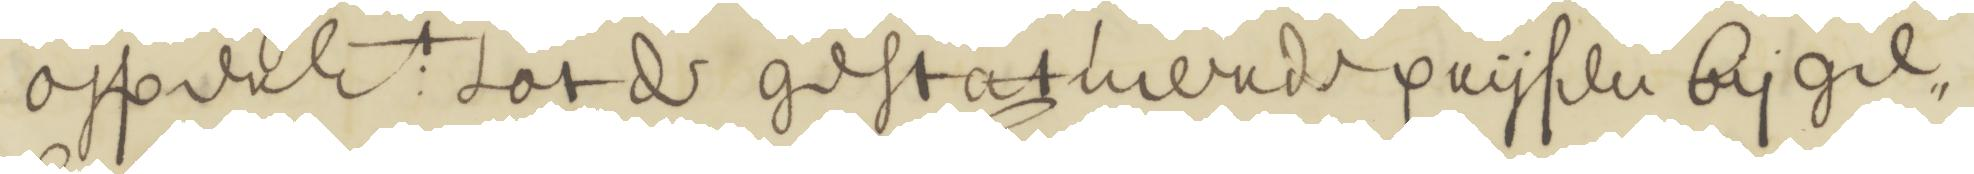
opperh:t tot de gestatueerde prijsen bij ge„
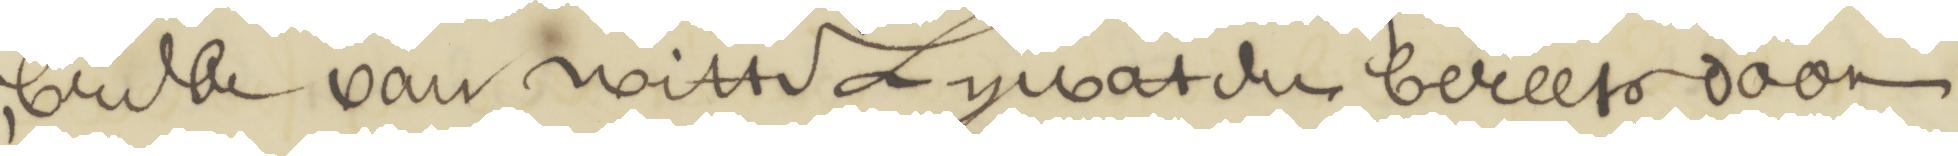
brek van witte Lywaten bereets door
